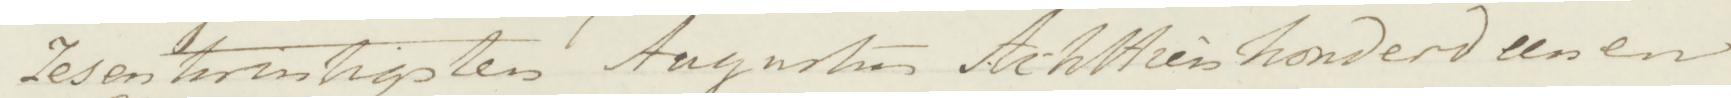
Zes en twintigsten Augustus Achttien honderd een en
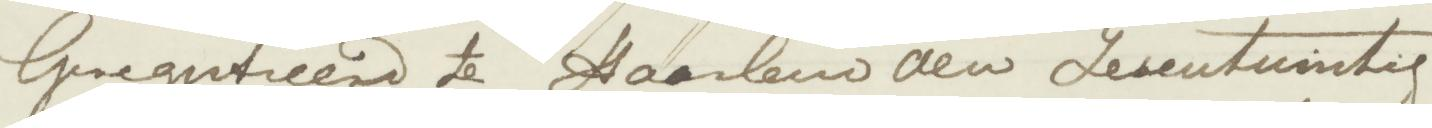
Geregistreerd te Haarlem den Zesentwintig
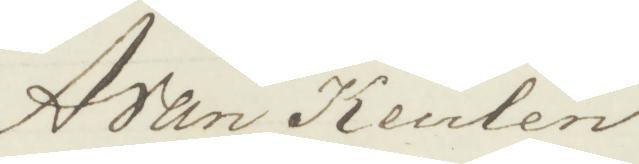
Avan Keulen
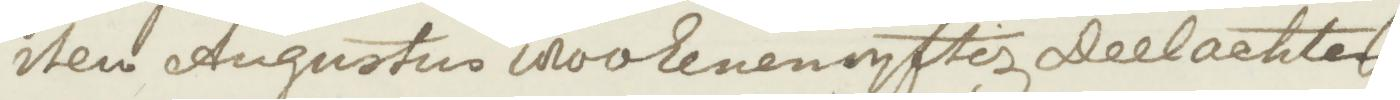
sten Augustus 1800Eenenvyftig Deel achten
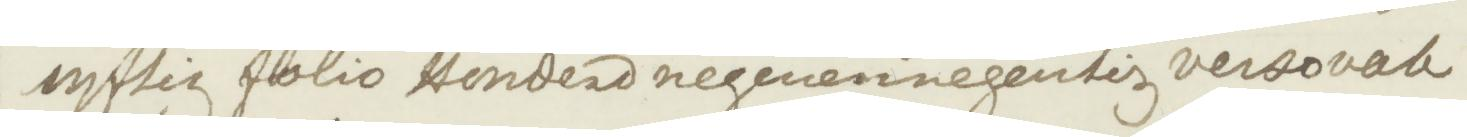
vyftig folio Honderd negenennegentig verso vak
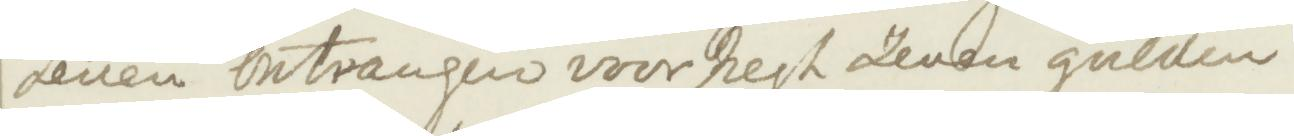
zeven ontvangen voor Regt zeven gulden
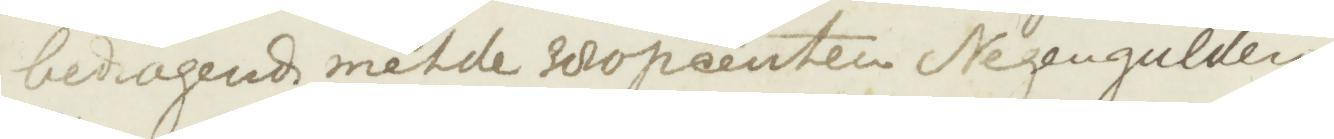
bedragend metde 38opcenten Negengulden
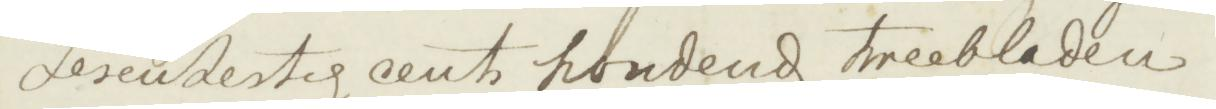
zesenzestig cents honderd tweebladen
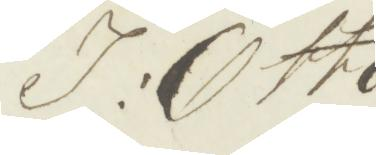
J: Otto
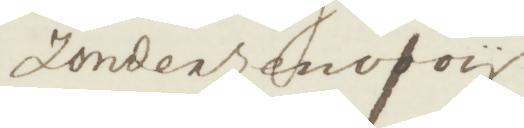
zonder renvooij
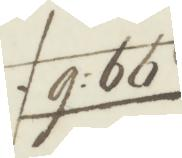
ƒ 9:66
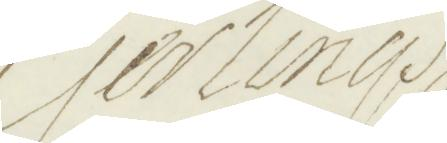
CGerlings Jr
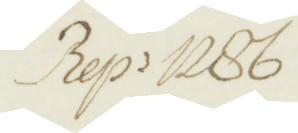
Rep: 1286
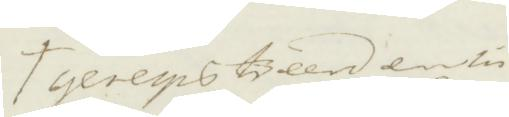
¶ geregistreerd en in
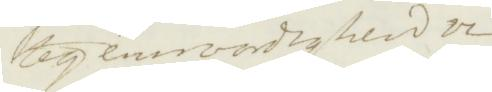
tegenwoordigheid van
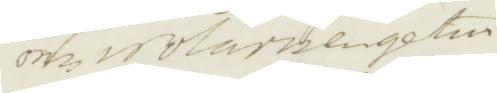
ons Notarisengetui
